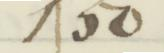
1 50
